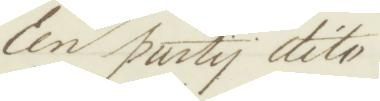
Een partij dito
